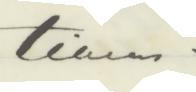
tiaren
